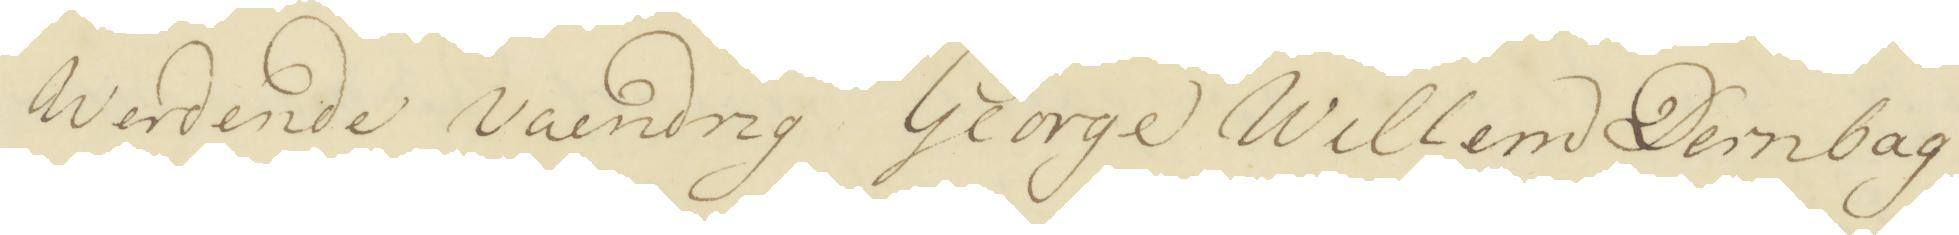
werdende vaendrig George Willem Dernbag
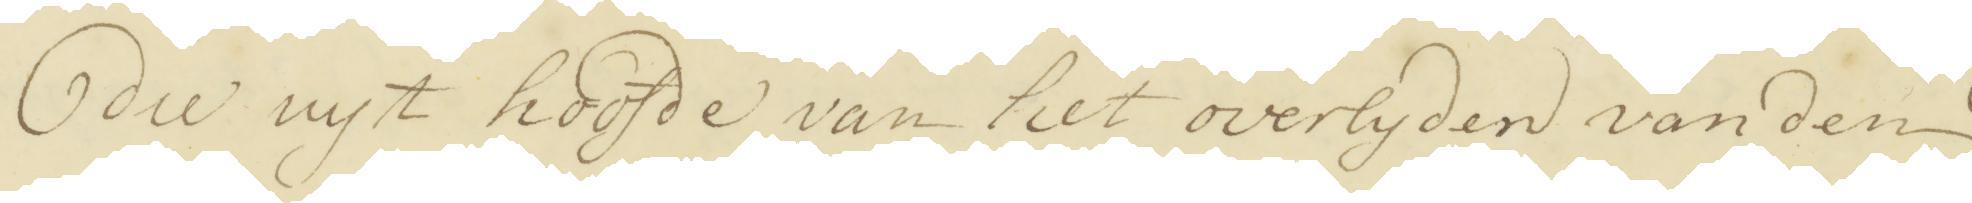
die uyt hoofde van het overlyden van den
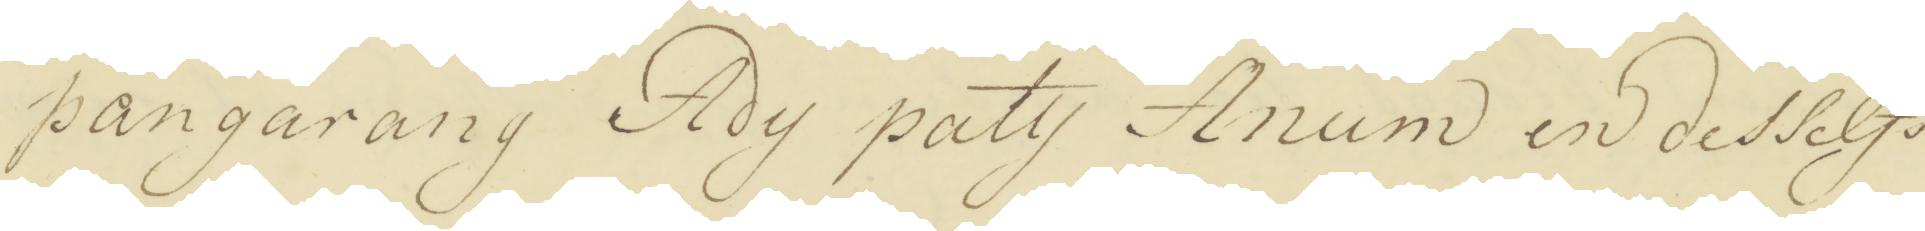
pangarang Adij patij Anum en desselfs
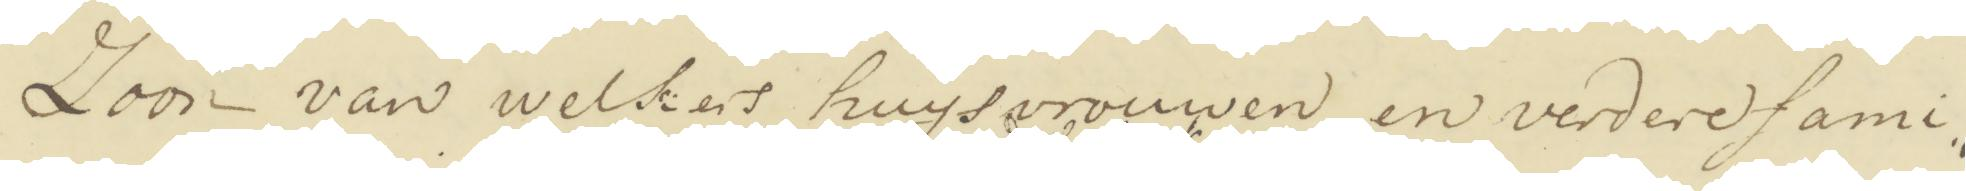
Zoon van welkers huysvrouwen en verdere fami„
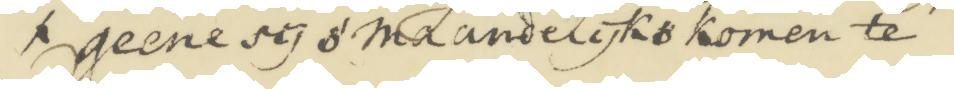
¶geene sij s' Maandelijks komen te
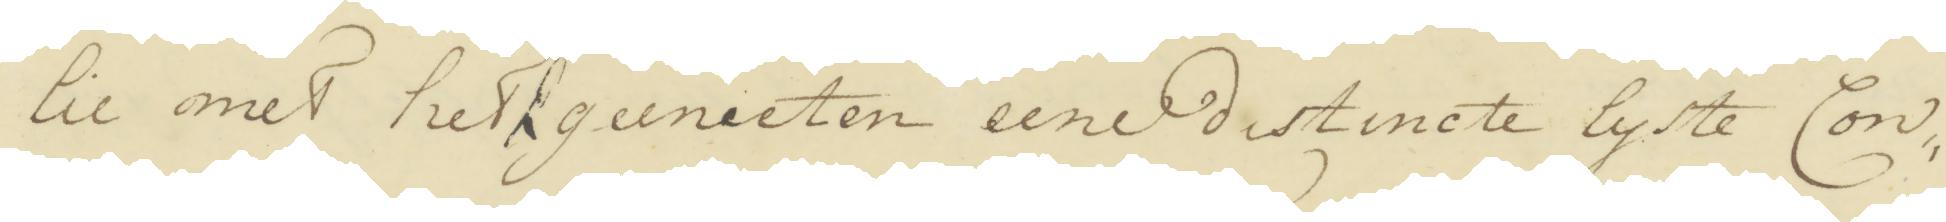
lie met het ¶ geenieten eene distincte lyste Con„
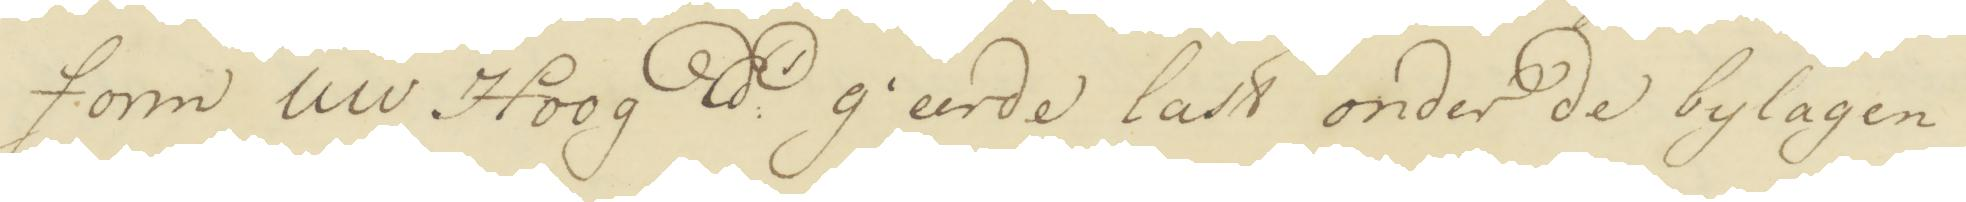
form uw Hoog Ed:s g’eerde last onder de bylagen
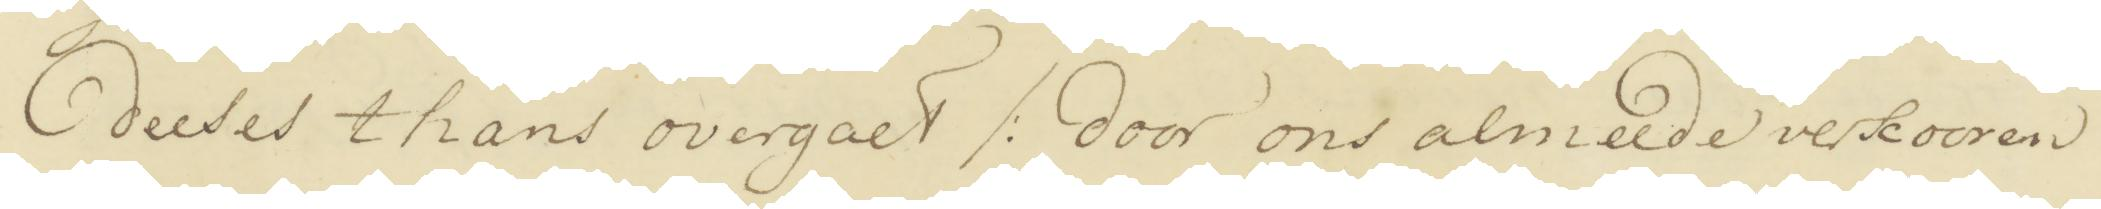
deeses thans overgaet /: door ons almeede verkooren
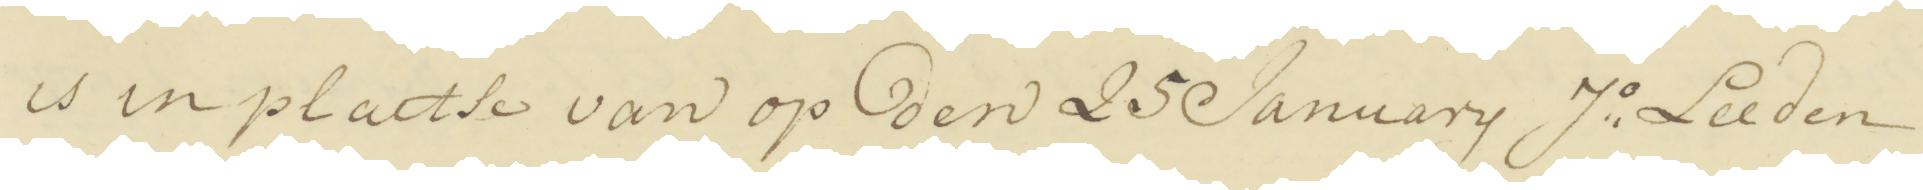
is in plaetse van op den 25 Ianuarij J:o Leeden
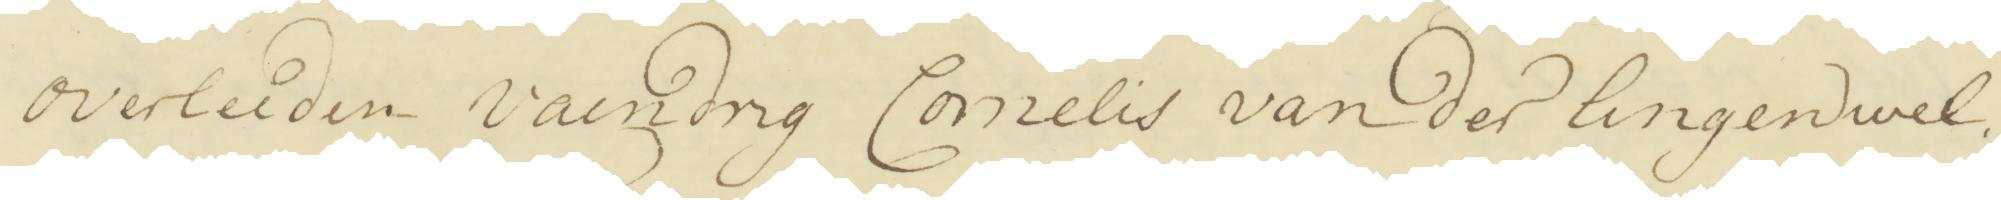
overleeden vaendrig Cornelis van der lingen wel,
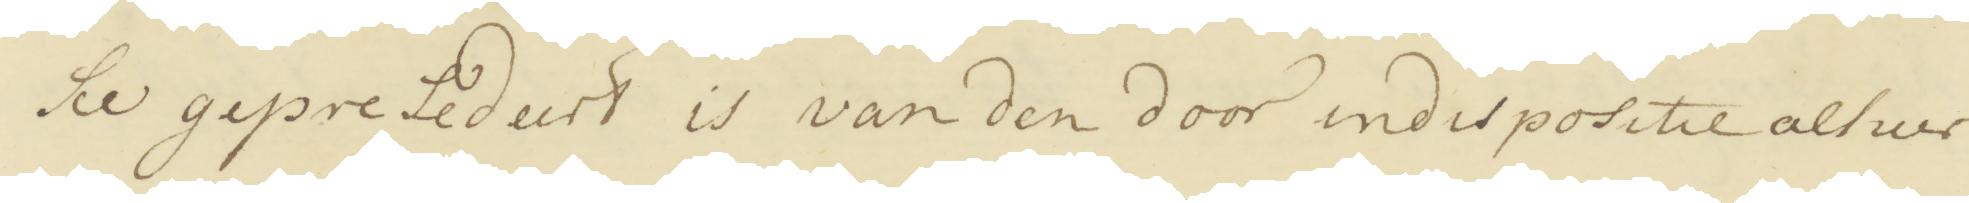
ke gepresedeert is van den door indispositie alhier
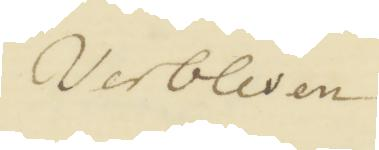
Verbleven
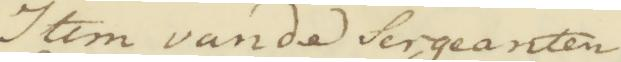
Item van de sergeanten
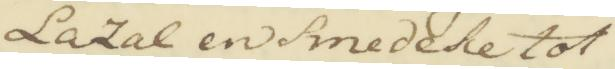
Lazal en Smedeke tot
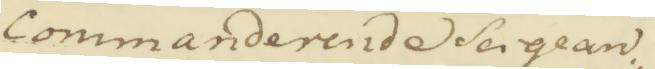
Commanderende sergean„
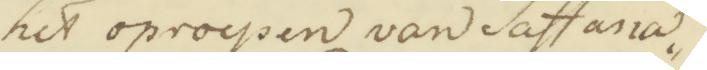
het oproepen van Jaffana„
